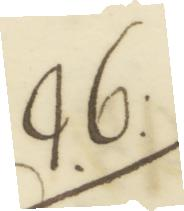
46:
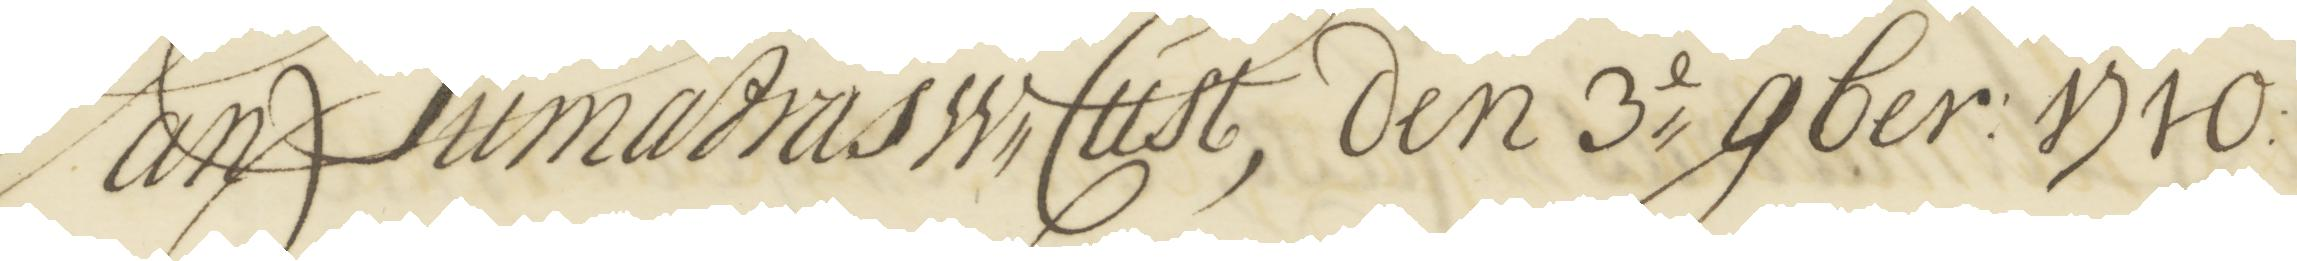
Van Sumatras w„t Cust, den 3„e 9ber: 1710:
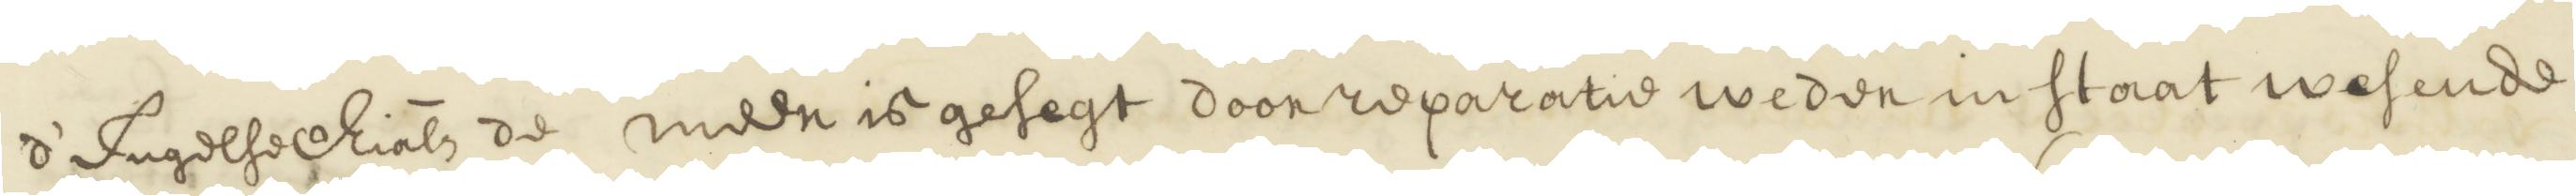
d’ Engelse chialen de meer is gesegt door reparatie weder in staat wesende
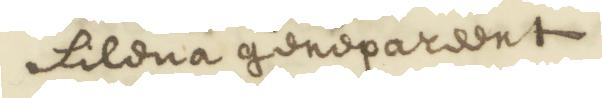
Silena gerepareert
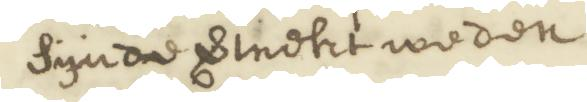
sijnde vertrekt weder
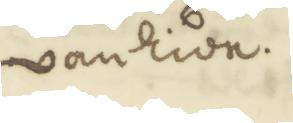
van hier.
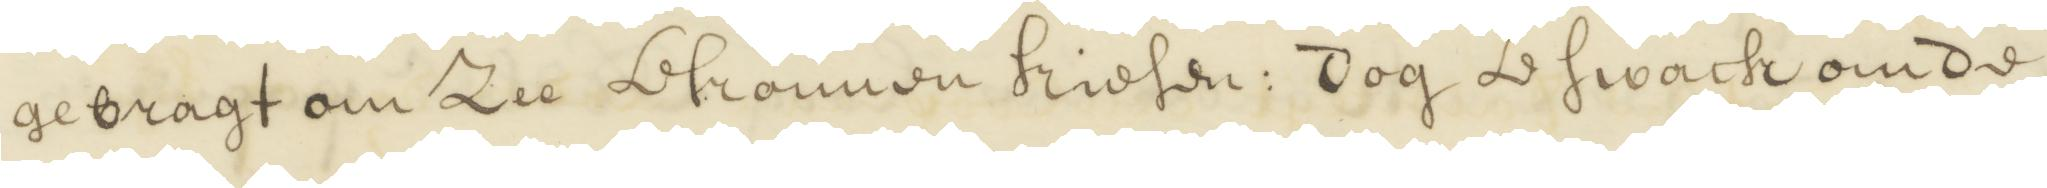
gebragt om zee tekonnen kiesen: dog te swack om de
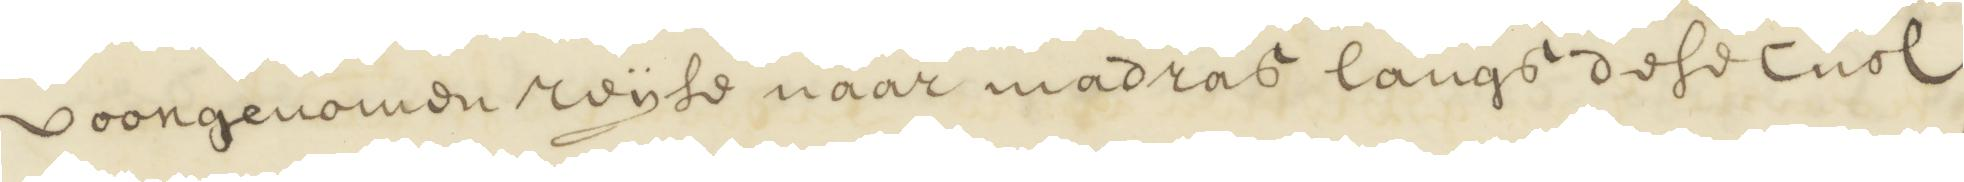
voorgenomen reijse naar madras langs dese cust
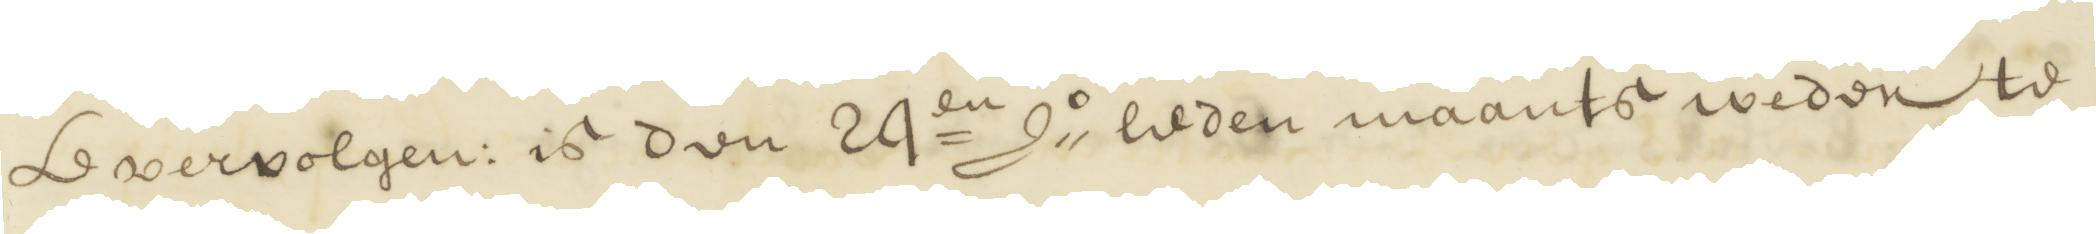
te vervolgen: is den 24=en j„o leden maants weder te
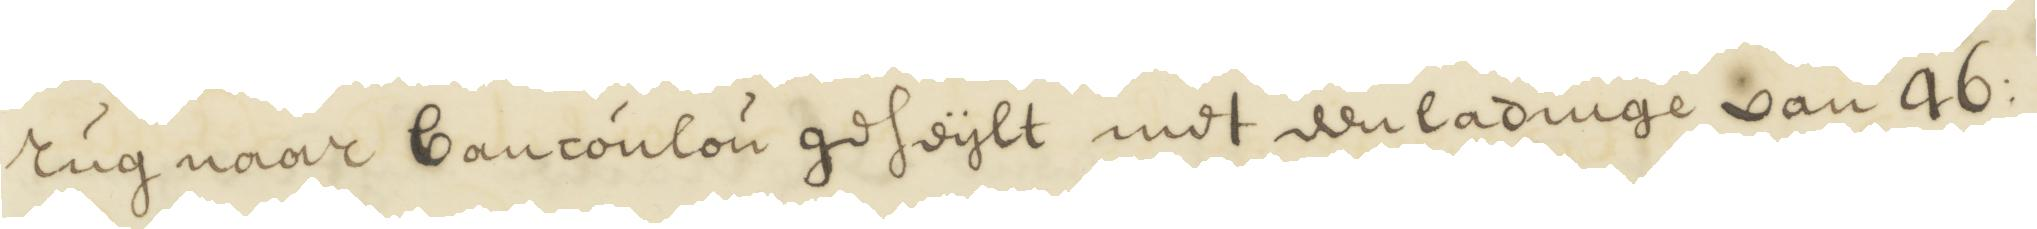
rug naar bancoulou geseijlt met een ladinge van 46:
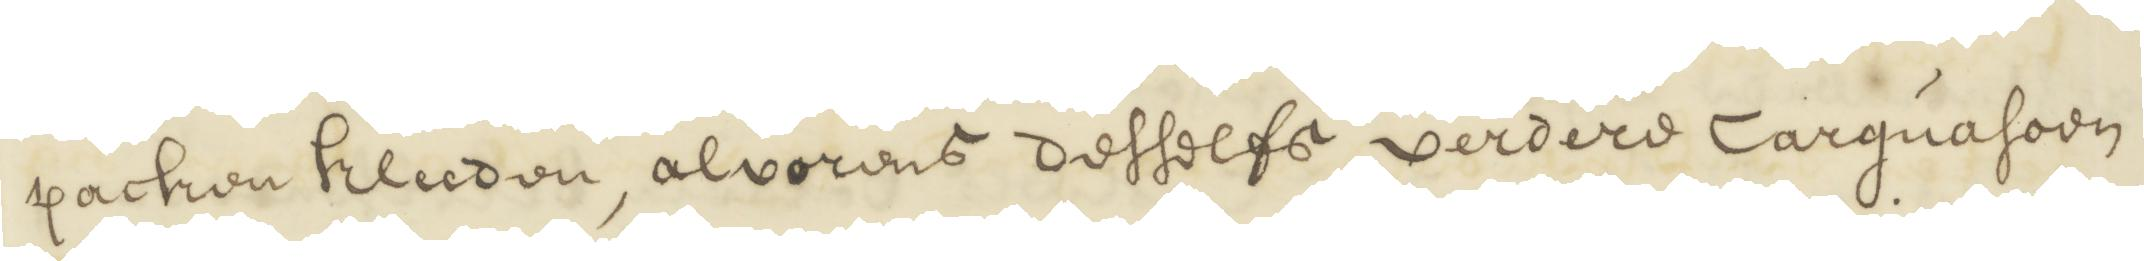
packen kleeden, alvorens desselfs verdere carguasoen
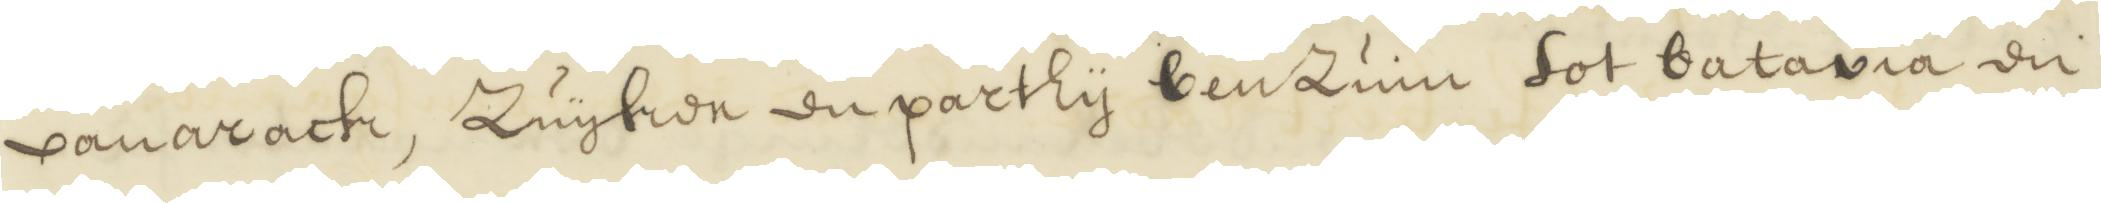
van arack, zuijker en parthij benzuin tot batavia en
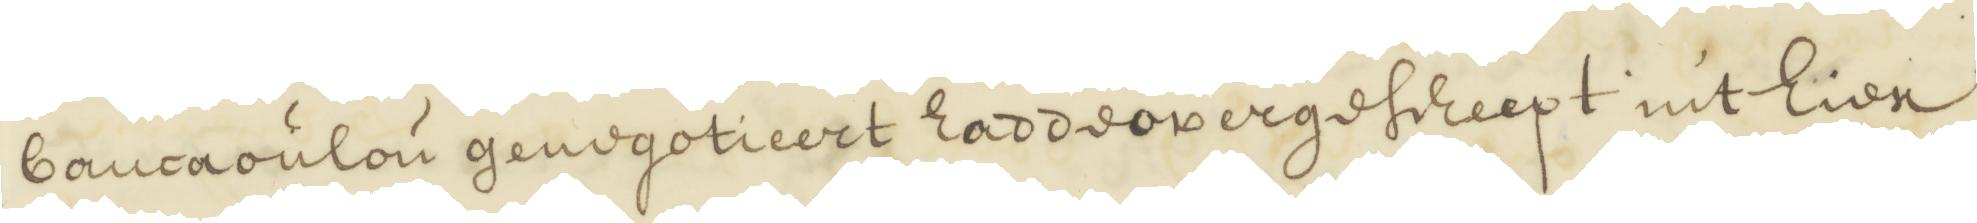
bancaoulou genegotieert hadde overgescheept in't hier
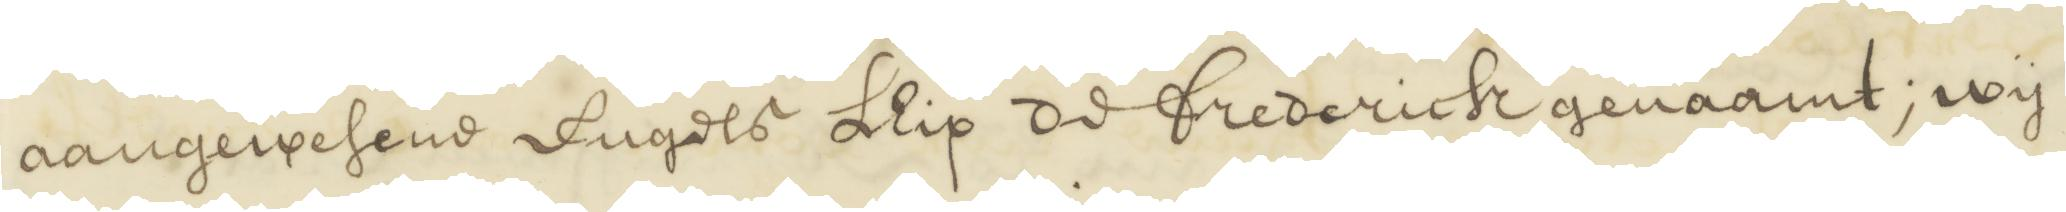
aangewesene Engels schip de Frederick genaamt; wij
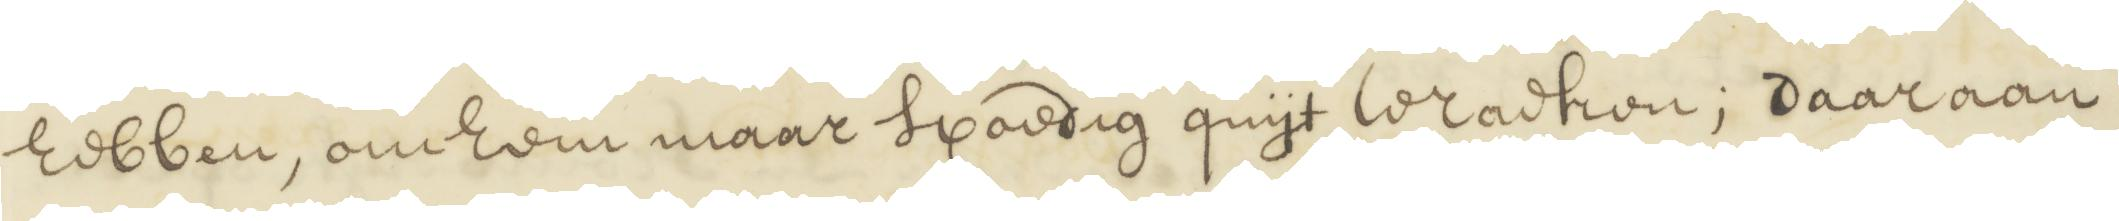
hebben, om hem maar spoedig quijt teraeken; daar aan
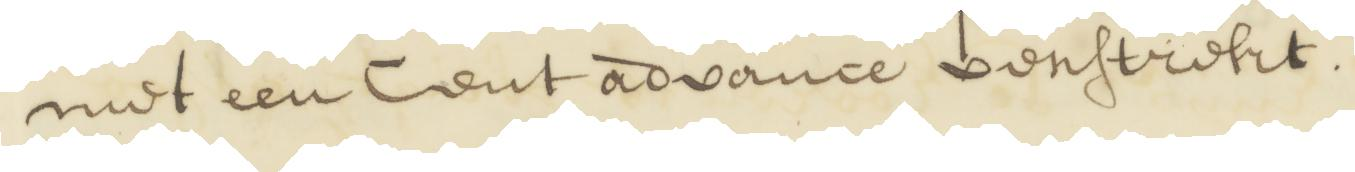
met een Cent advance venstrekt.
